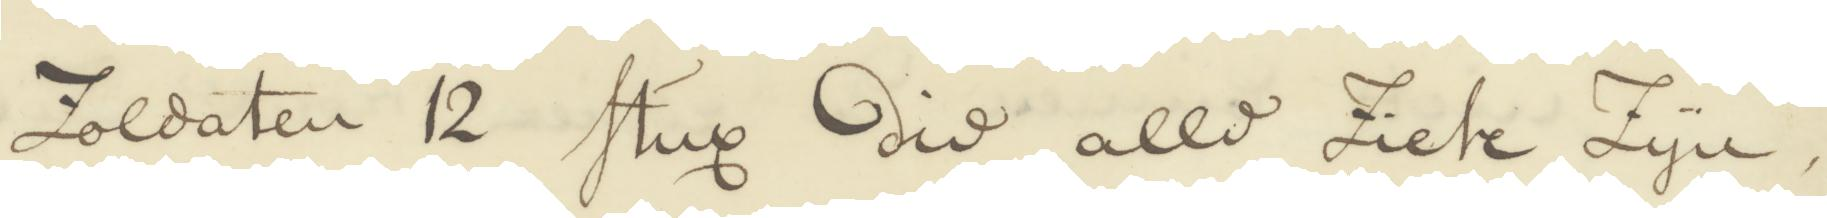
zoldaten 12 stux die alle ziek zijn,
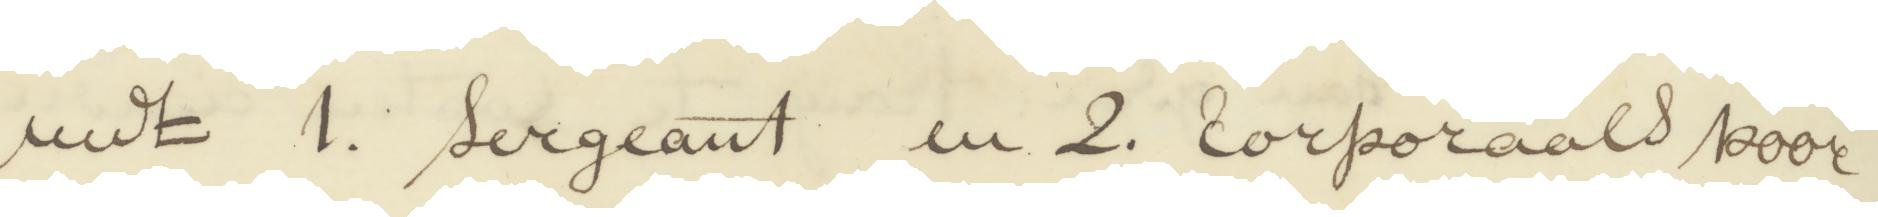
met 1. sergeant en 2. corporaals voor
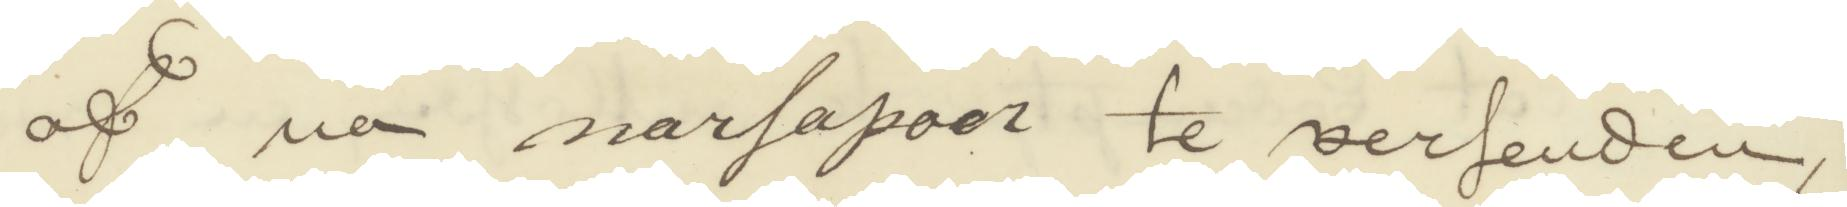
af na narsapoer te versenden,
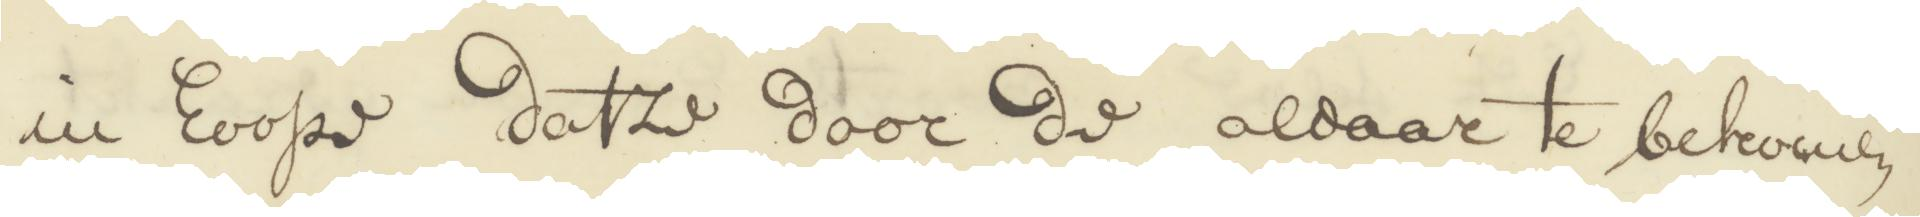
in hoope datze door de aldaar te bekomen
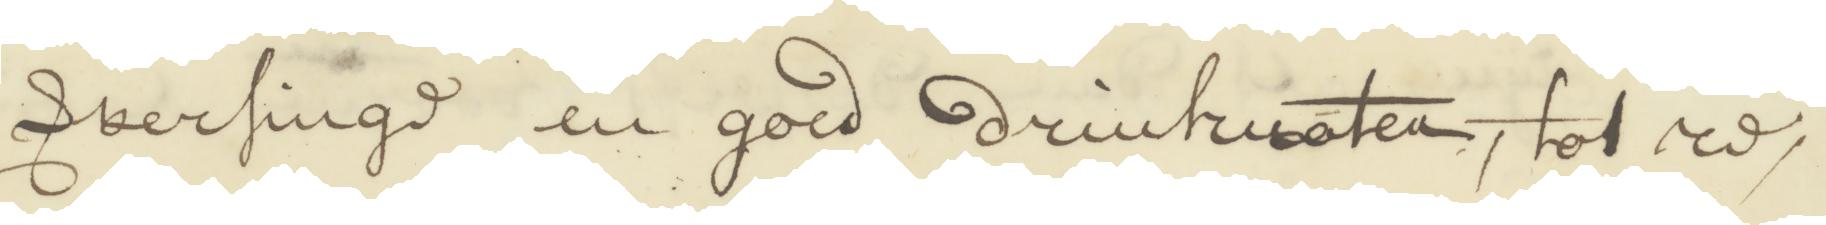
verversinge en goed drinkwater, tot re,
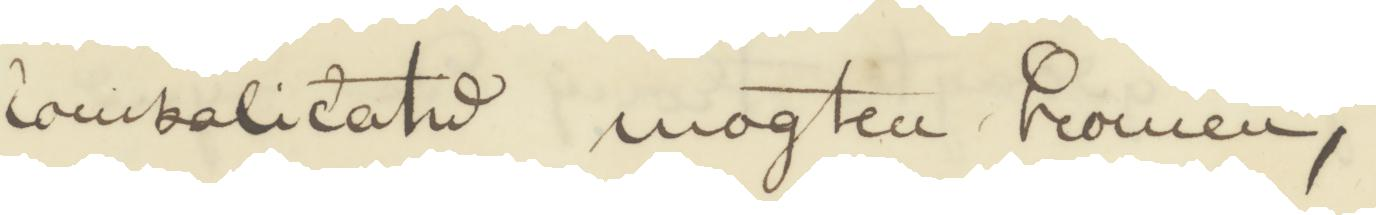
comvalicatie mogten komen,
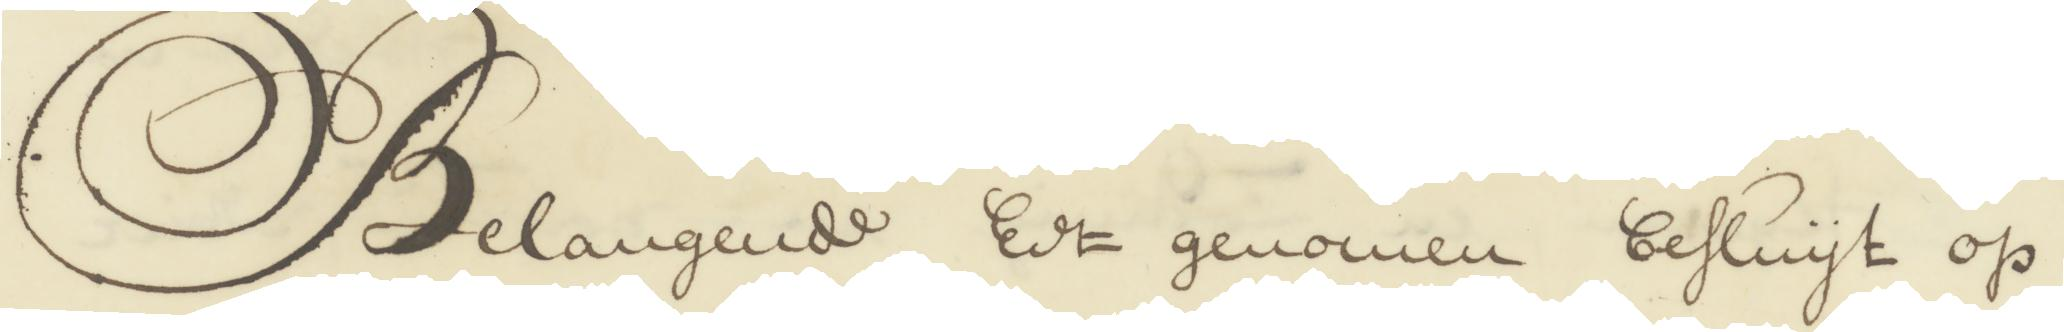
Belangende het genomen besluijt op
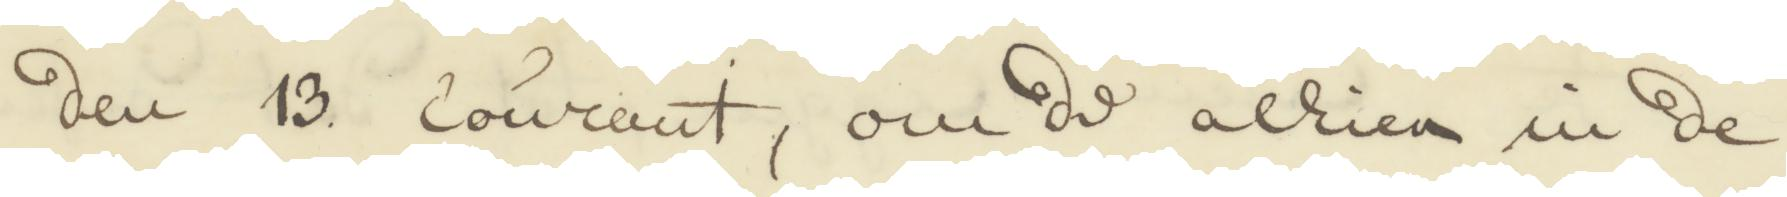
den 13. courant, om de alhier in de
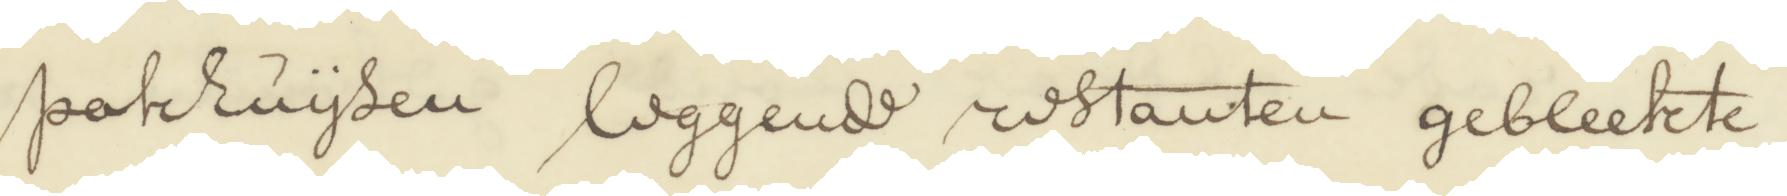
pakhuijsen leggende restanten gebleekte
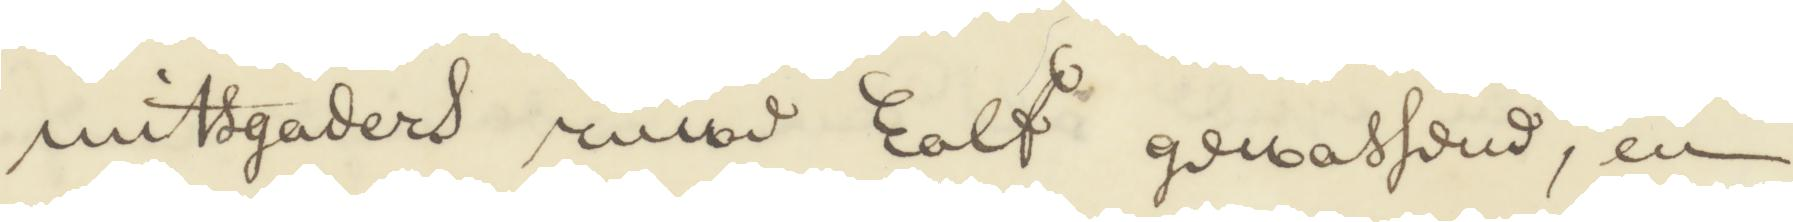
mitsgaders ruwe half gewassend, en
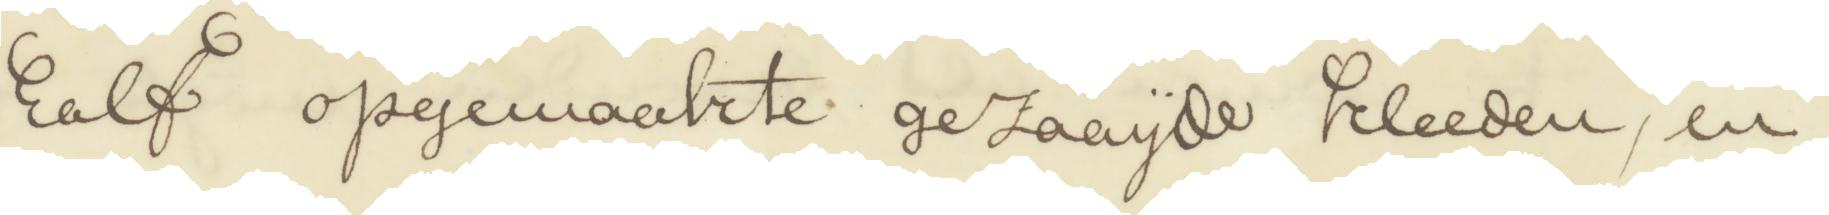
half opgemaakte gezaaijde kleeden, en
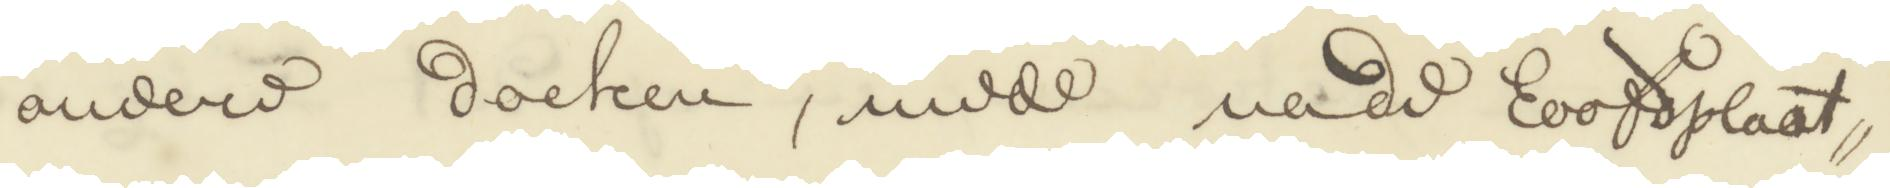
andere doeken, mede nade hoofdplaat„
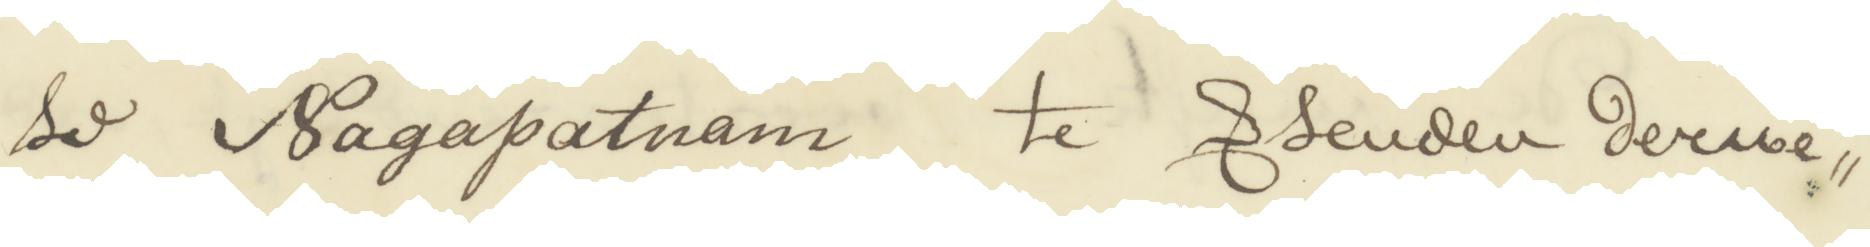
se Nagapatnam te versenden derwe„
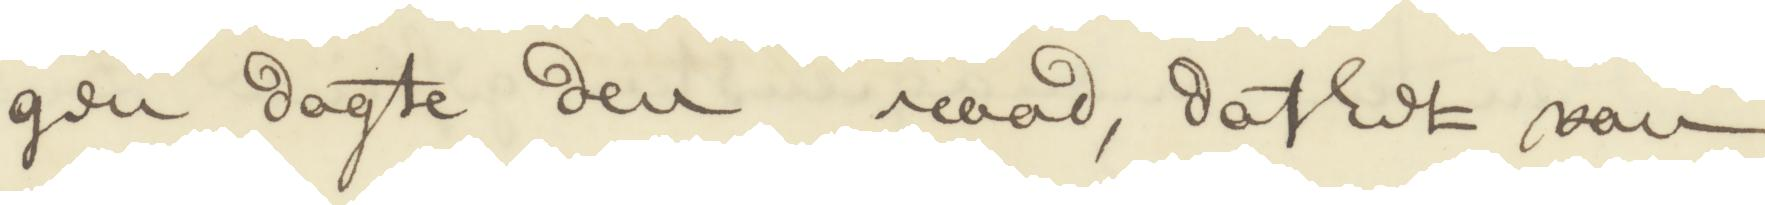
gen dagte den raad, dathet van
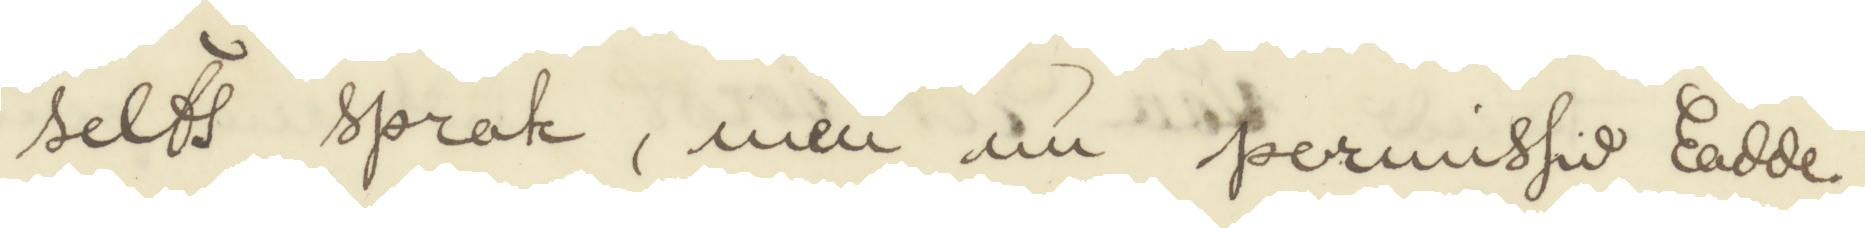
selfs sprak, men nu permissie hadde
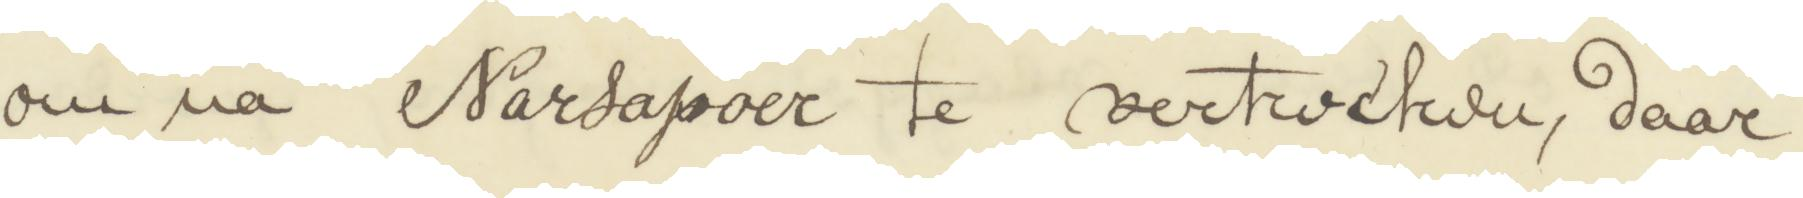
om na Narsapoer te vertrecken, daar
